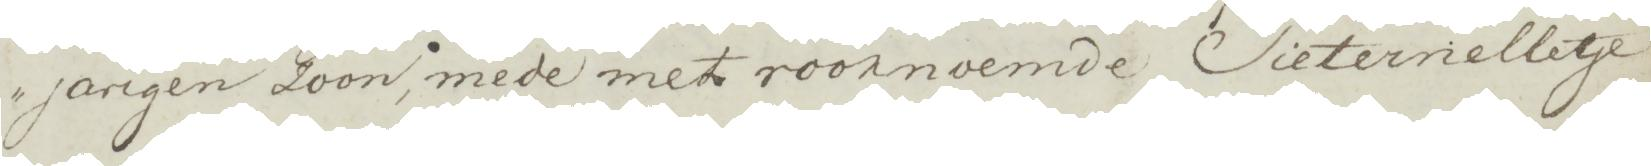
„jarigen zoon, mede met voornoemde Pieternelletje
